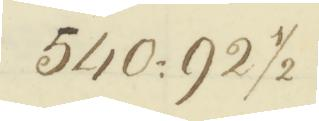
540:92½
